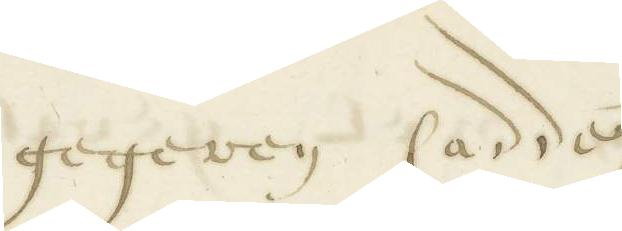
gegeven hadde, dat het vonnis bij d' E
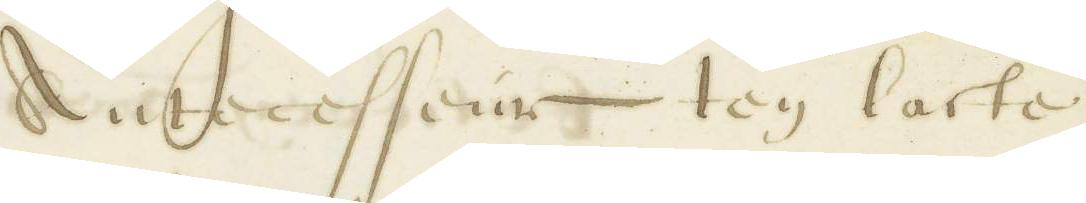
Heer Eij=rs Antecesseur ten laste
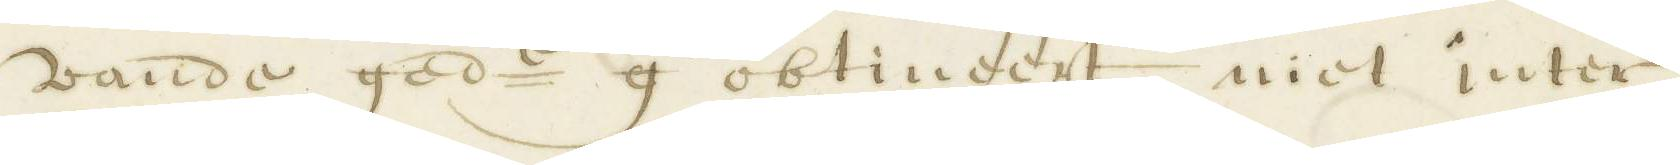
vande ged=e g' obtineert niet inter
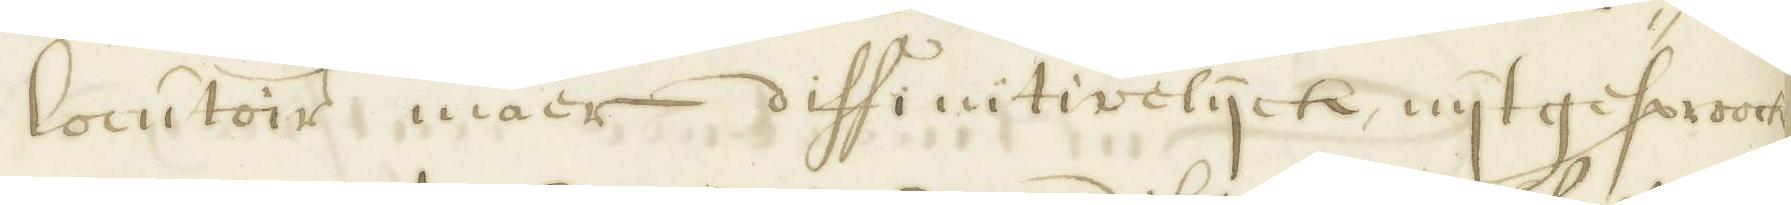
locutoir maer diffinitivelijck, uijtgesproock
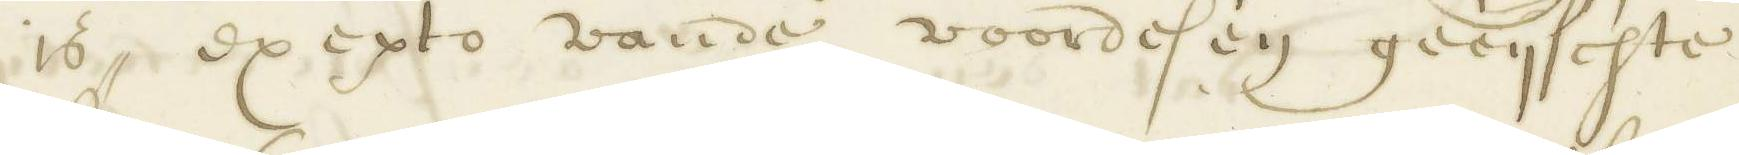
is, exepto van de voordesen geeijschte
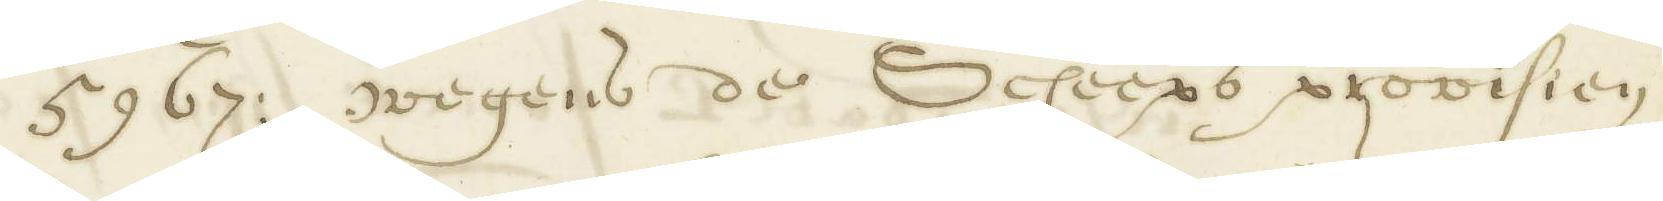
5967: wegens de Scheeps provisien
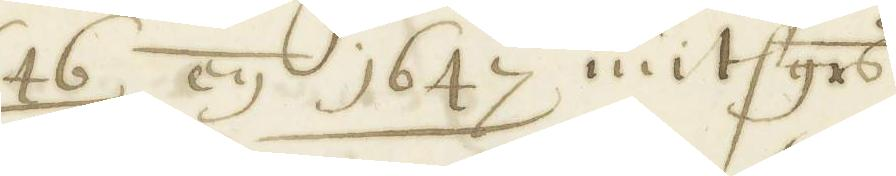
der Jaeren 1646 en 1647 mitsgrs
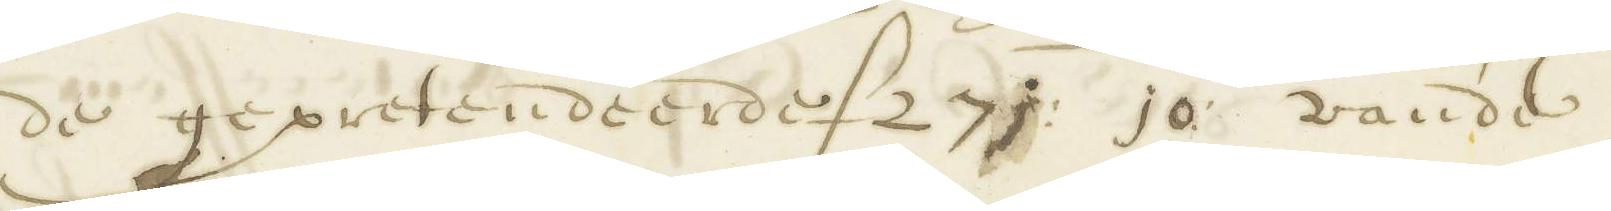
de gepretendeerde ƒ271: 10: van de
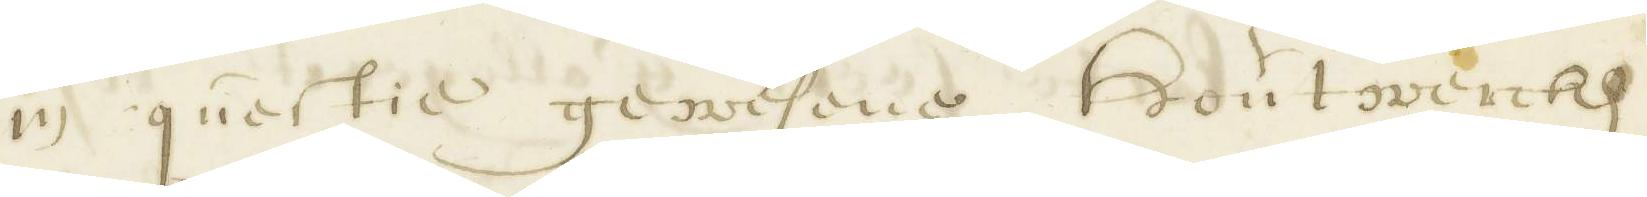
in questie gewesene Houtwercke
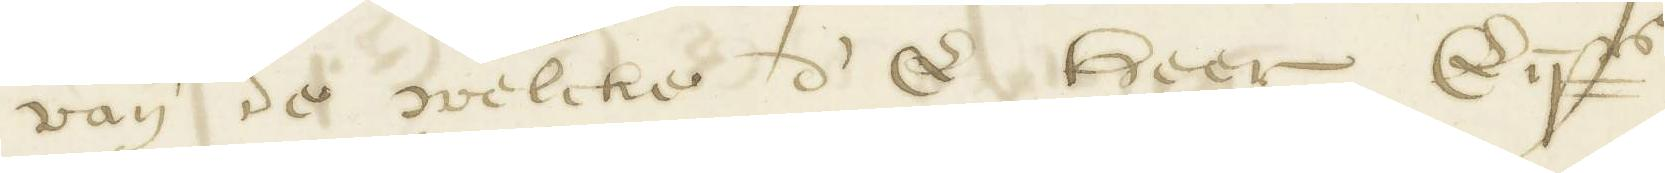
van de welcke d’ E Heer Eij=rs
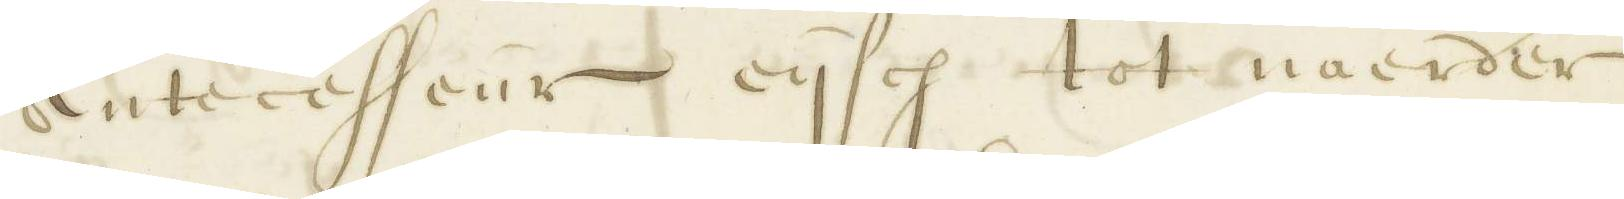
Antecesseur eijsch tot naerder
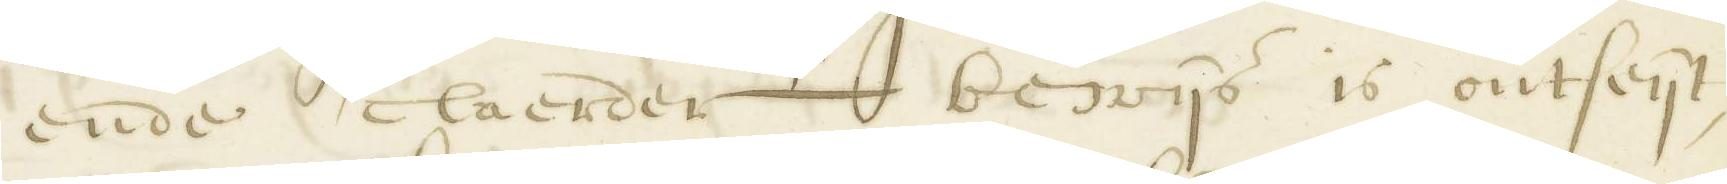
ende claerder bewijs is ontseijt,
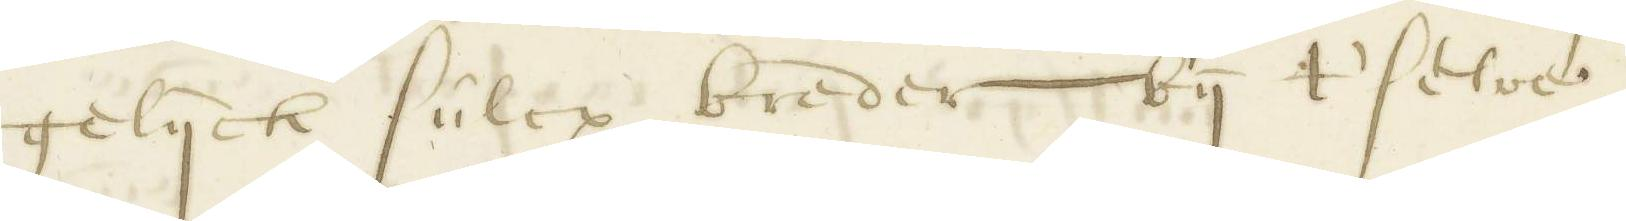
gelijck sulcx breder bij t'selve
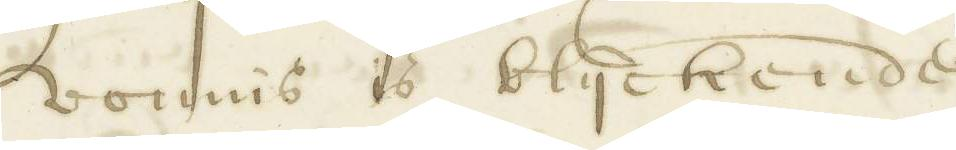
vonnis is blijckende
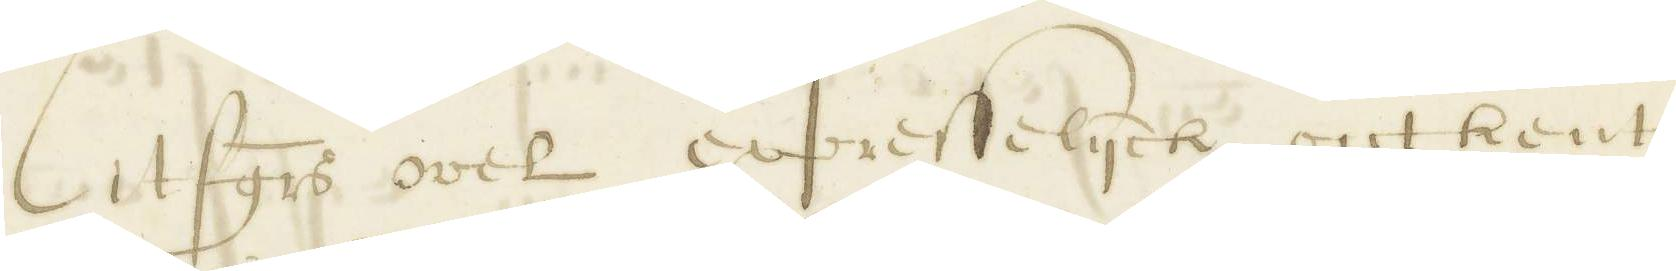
Mitsgrs wel expresselijck ontkent
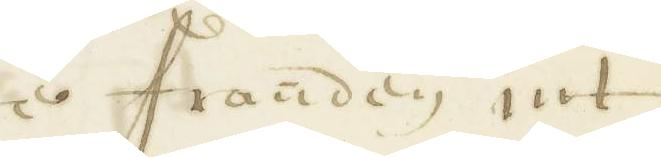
eenige de minste frauden int
